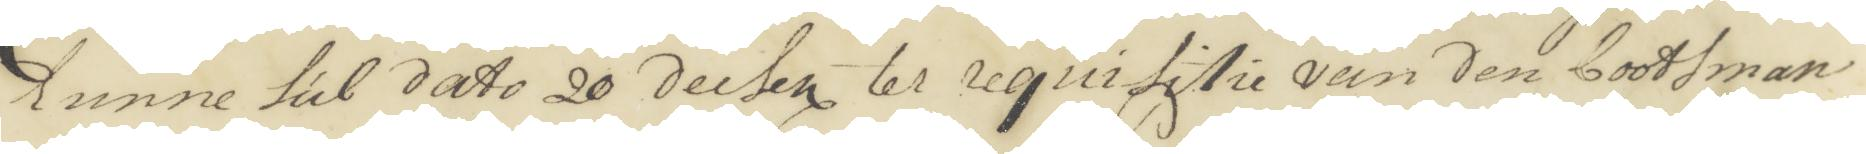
hunne sub dato 20 deesen ter requisitie van den bootsman
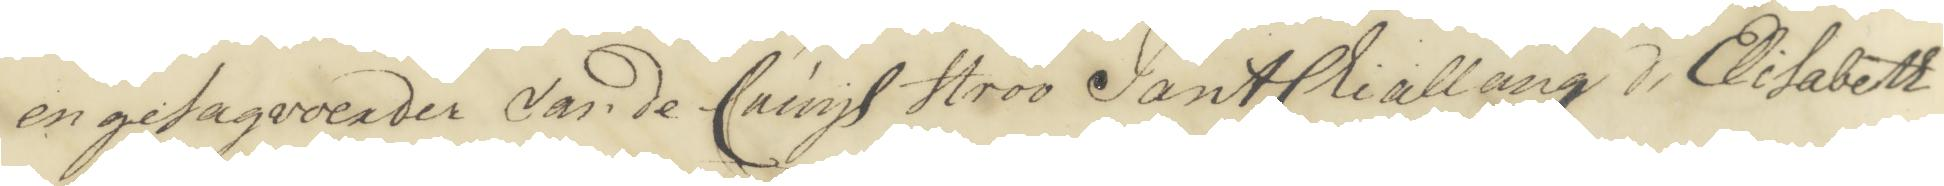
en gesagvoerder van de Cruijs stroo Pantchiallang d, Elisabeth
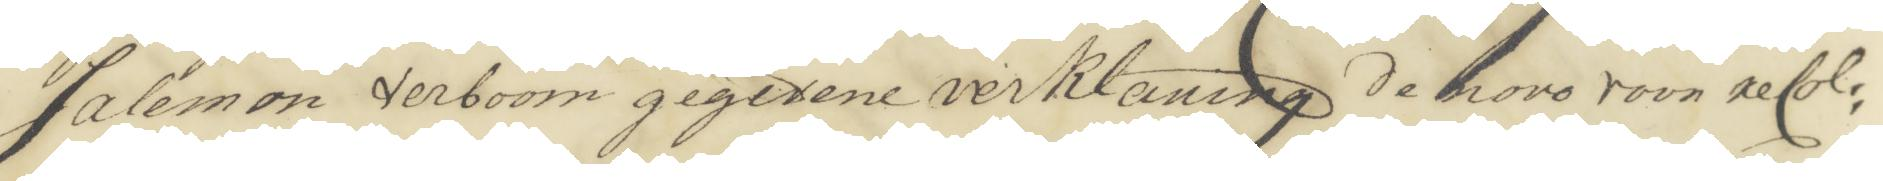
Salemon verboom gegevene verklaring de novo voor recol„
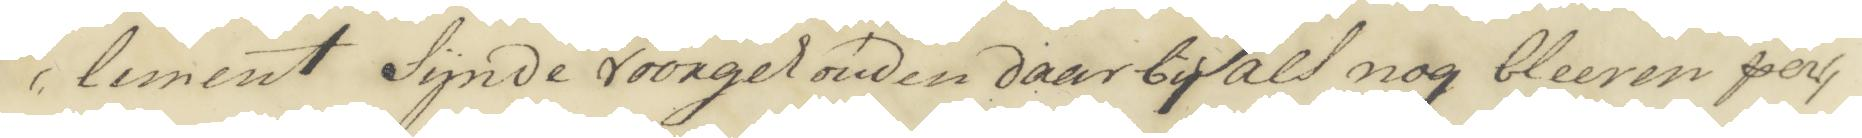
„liment sijnde voorgehouden daar bij als nog bleeven per„
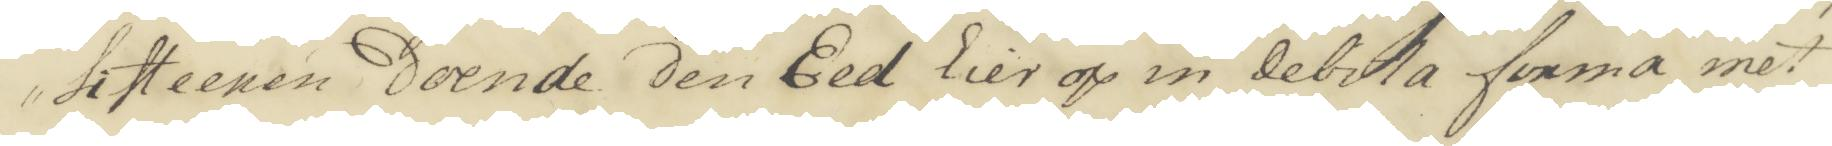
„sisteeren doende den Eed hier op in debita forma met
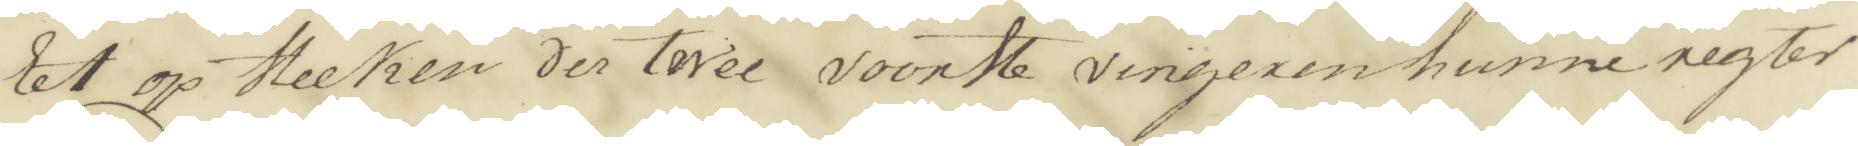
het op steeken der twee voorste vingeren hunne regter
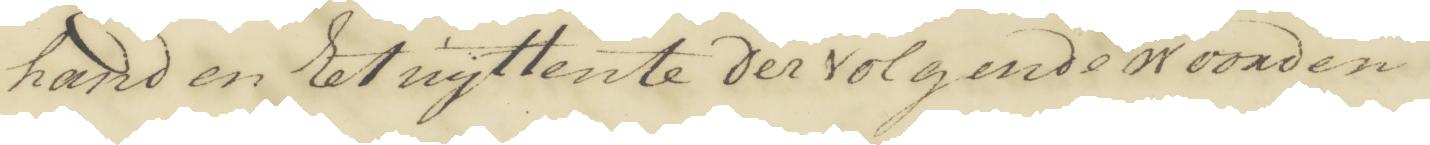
hand en het uijttente der volgende woorden
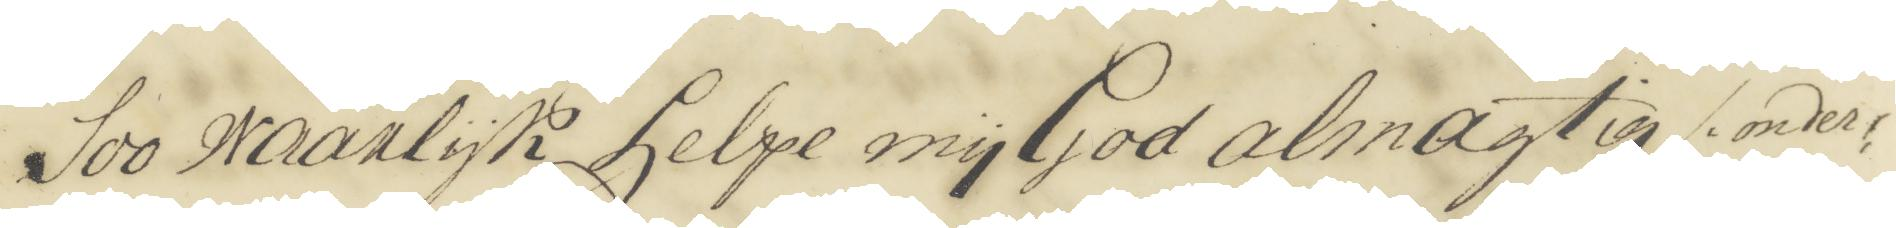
soo waarlijk helpe mij God almagtig /: onder„
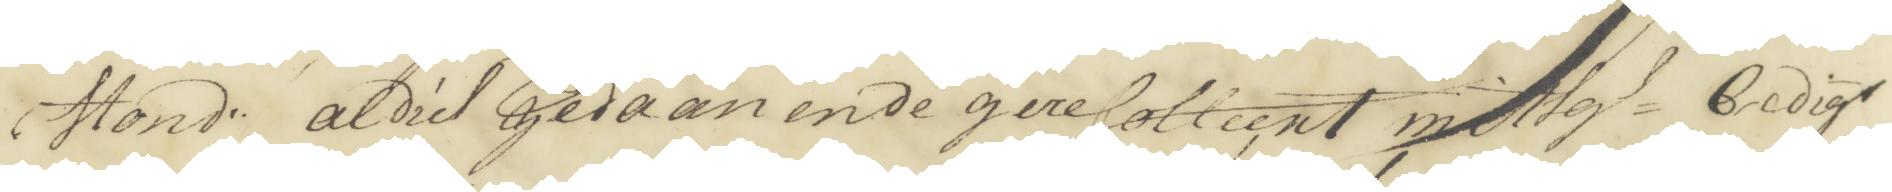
„stond: aldus gedaan ende gerecolleert mitsg=s b,edigt
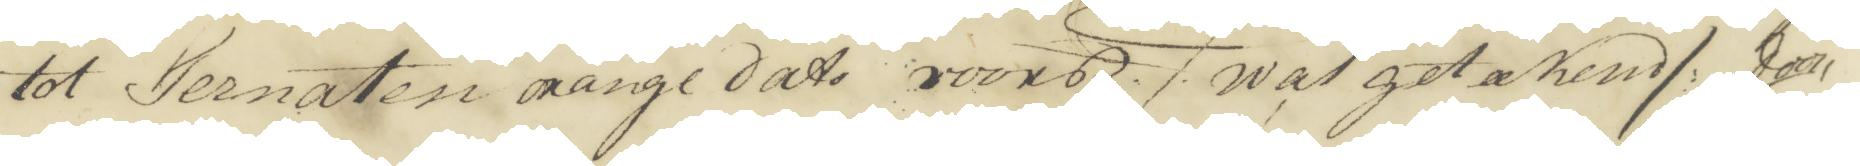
tot Ternaten orange dato voorz: /:was geteekend /: door
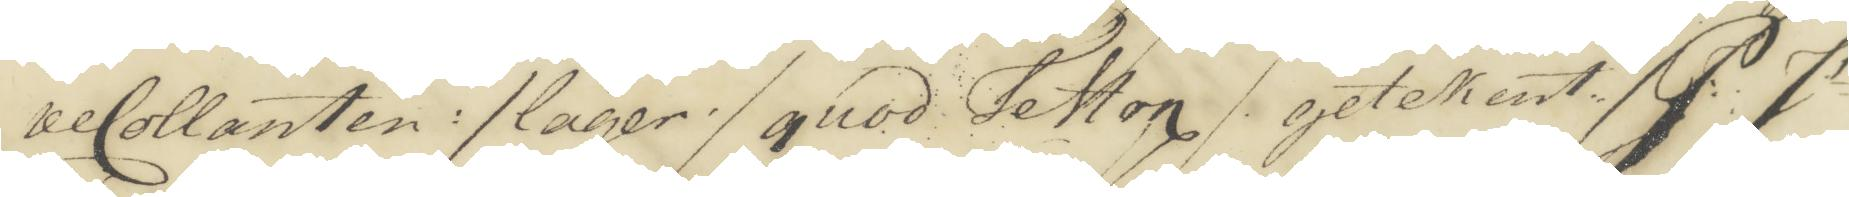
recollanten :/ lager ./ quod Testor /. getekent:/ P: J
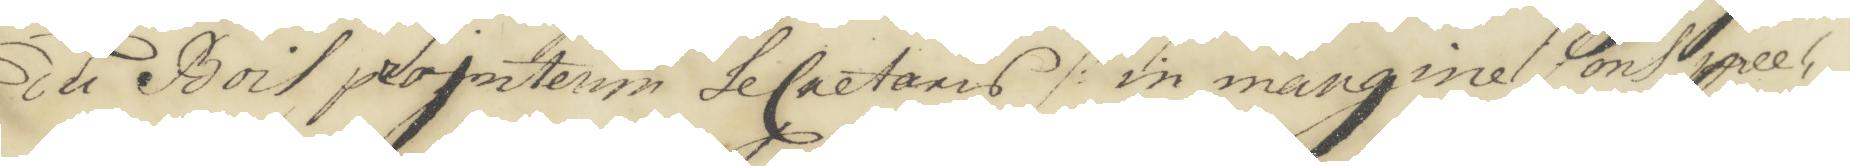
du Bois pro jnterim secretaris /: in margine ons pree„
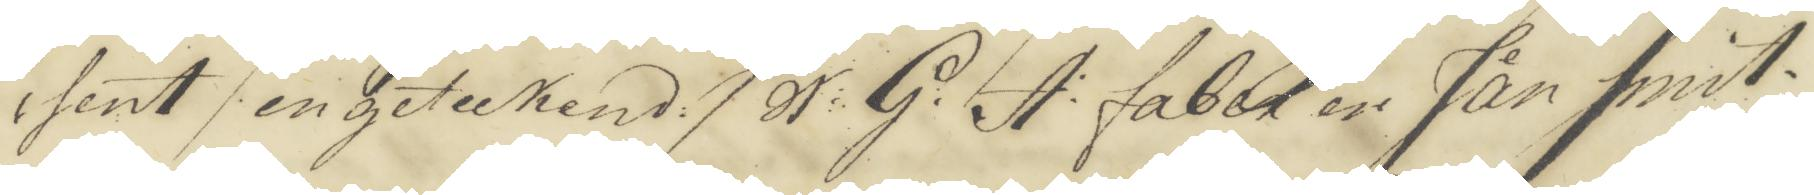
„sent /. en geteekend:/ W: G: A: faber en Jean Smit.
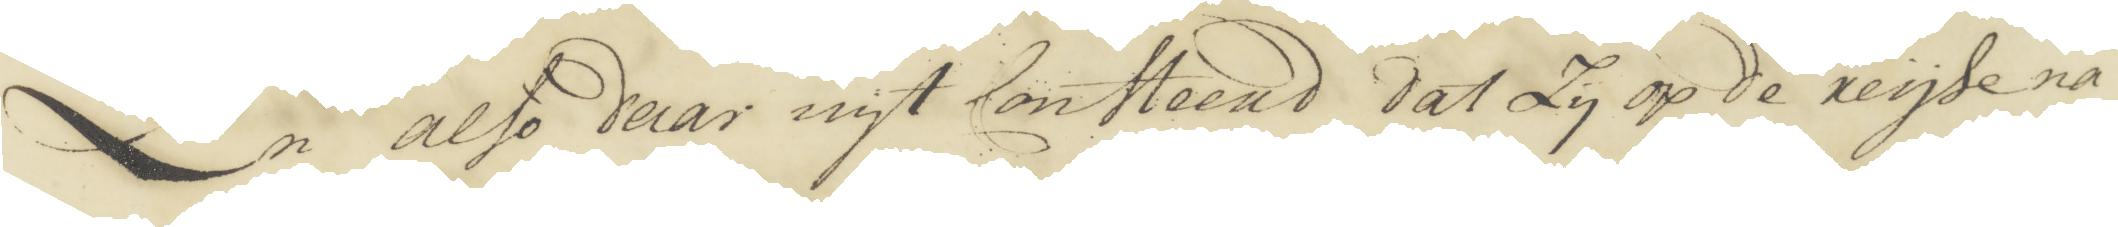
En also daar uijt consteerd dat zij op de reijse na
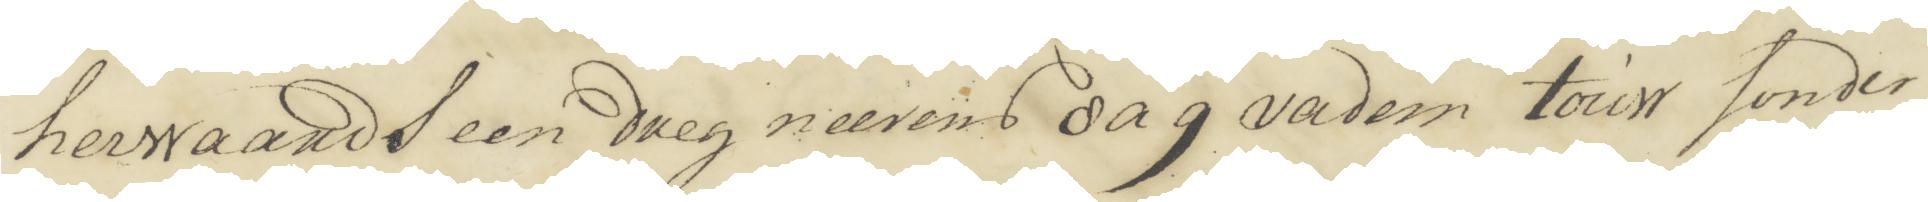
herwaards een dreg neevens 8 a 9 vadem touw sonder
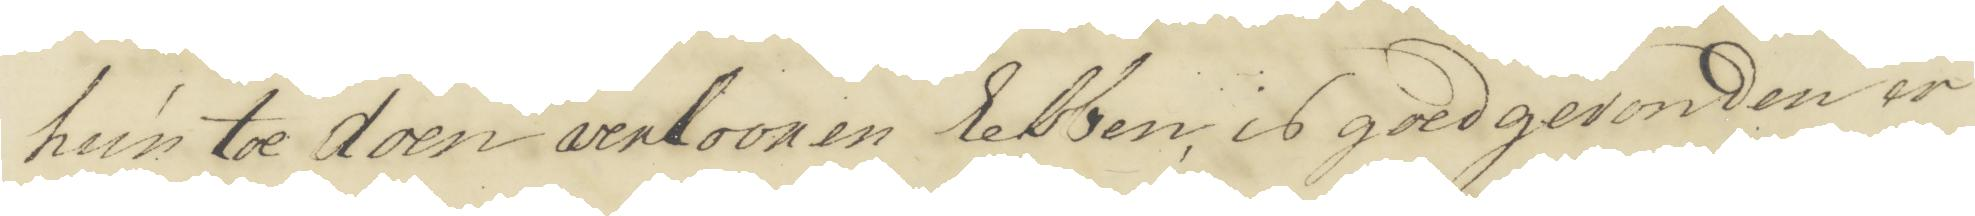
hun toe doen verlooren hebben, is goedgevonden en
